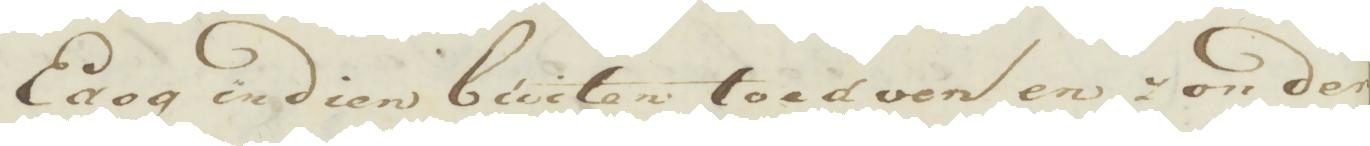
Edog indien buiten toedoen en zonder
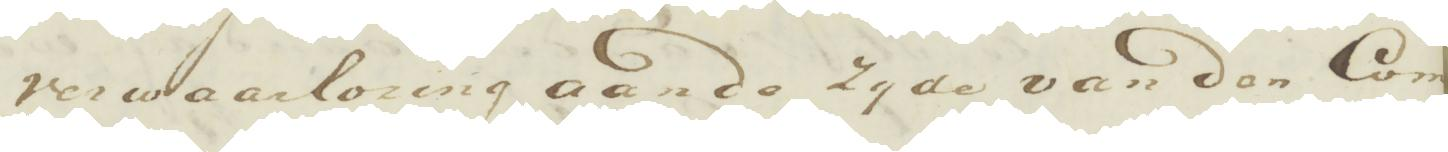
verwaarlozing aan de zyde van den Com
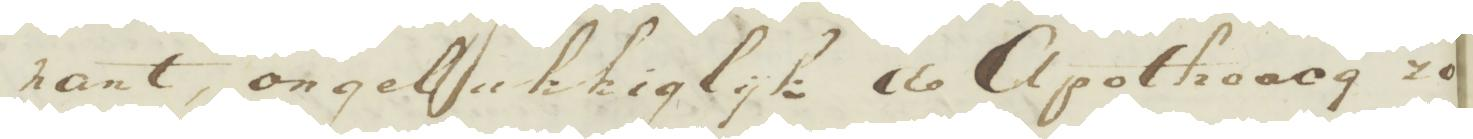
rant, ongelukkiglijk de Apothoacq zo
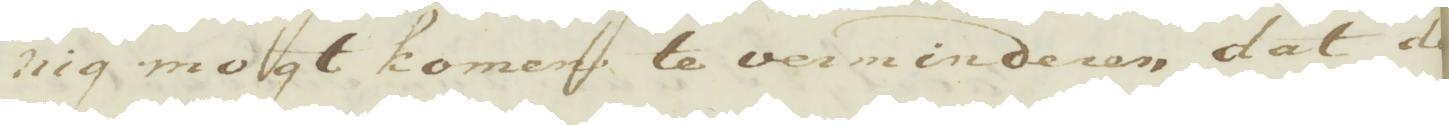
nig mogt komen te verminderen dat de
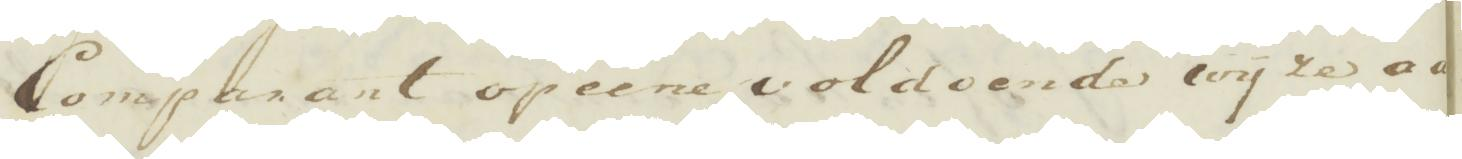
Comparant op eene voldoende wijze aa
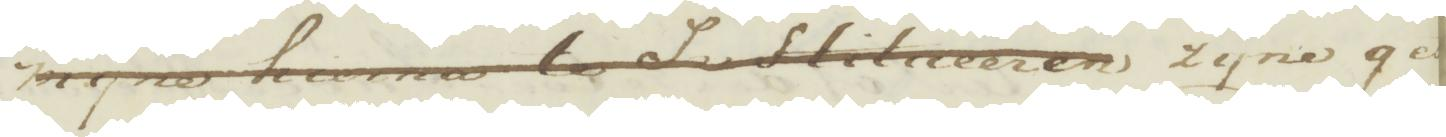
myne hierna te sustitueeren zyne ge
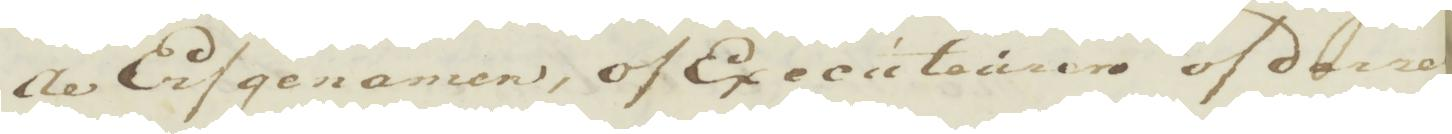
de Erfgenamen, of Executeuren of darre
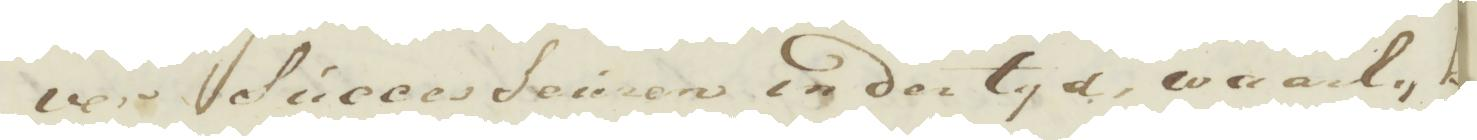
ver successueren in der tyd, waarlyk
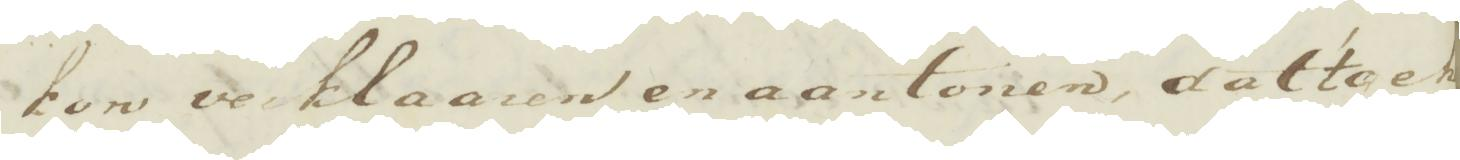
kon verklaaren en aantonen, dat 't ge
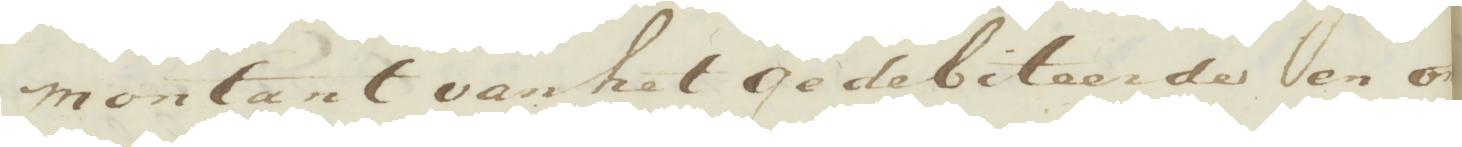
montant van het gedebiteerde en on
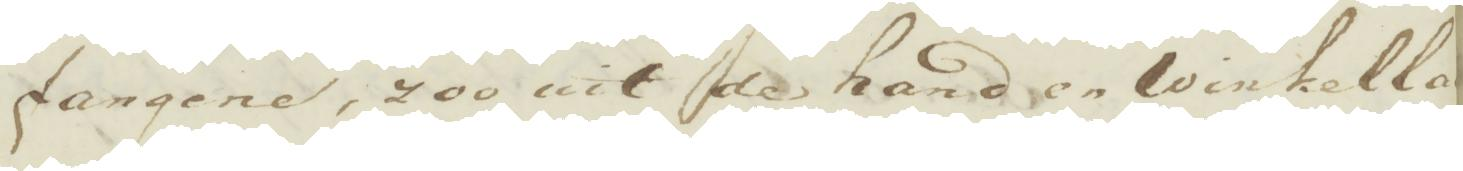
fangene, zoo uit de hand en winkella
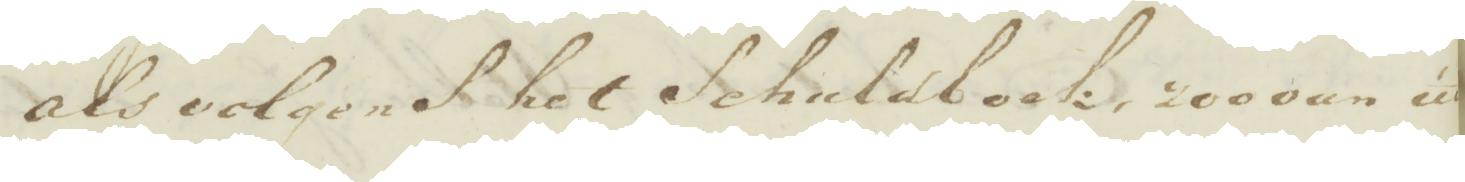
als volgens het Schuldboek, zoo van u
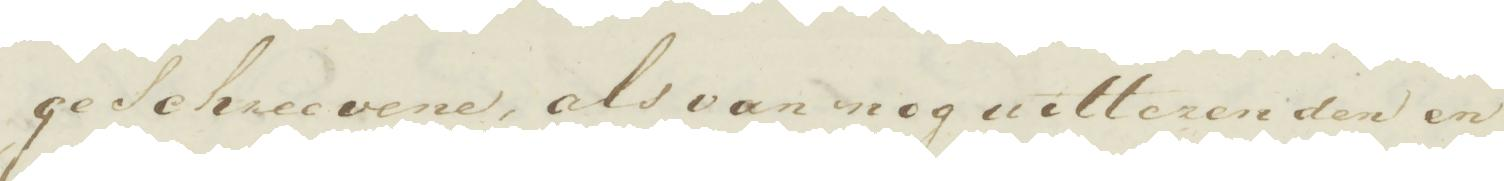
geschreevene, als van nog uittezenden en
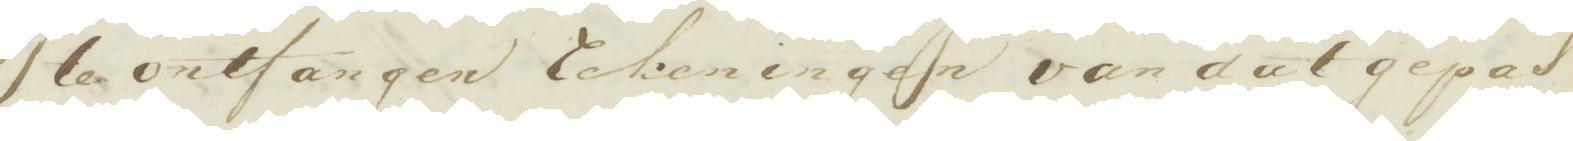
te ontfangen rekeningen van dat gepas
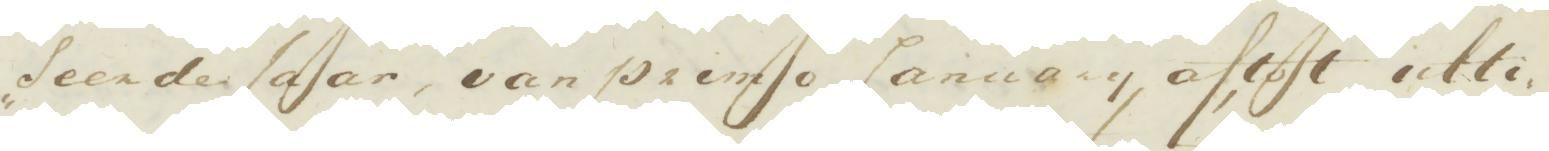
„seerde Jaar, van primo January of, tot ulti„
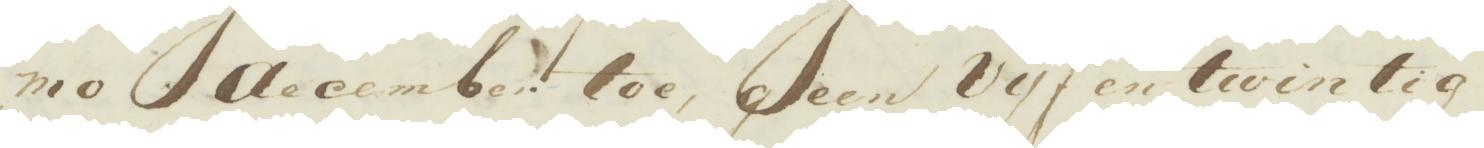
„mo december toe, geen vyf en twintig
